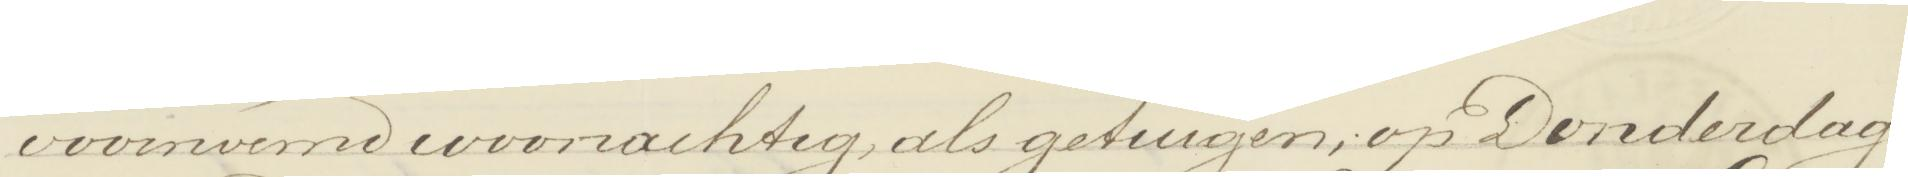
voornoemd woonachtig, als getuigen, op Donderdag
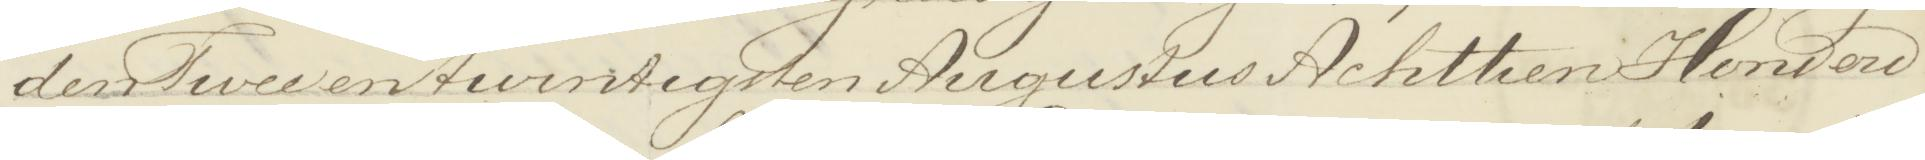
den Twee entwintigsten Augustus Achttien Honderd
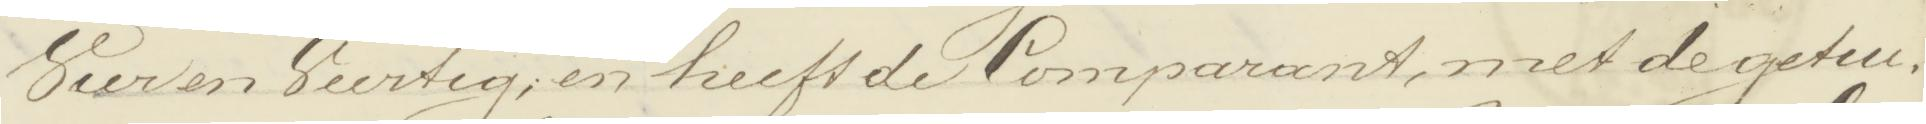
Vier en Veertig; en heeft de Comparant, met de getui„
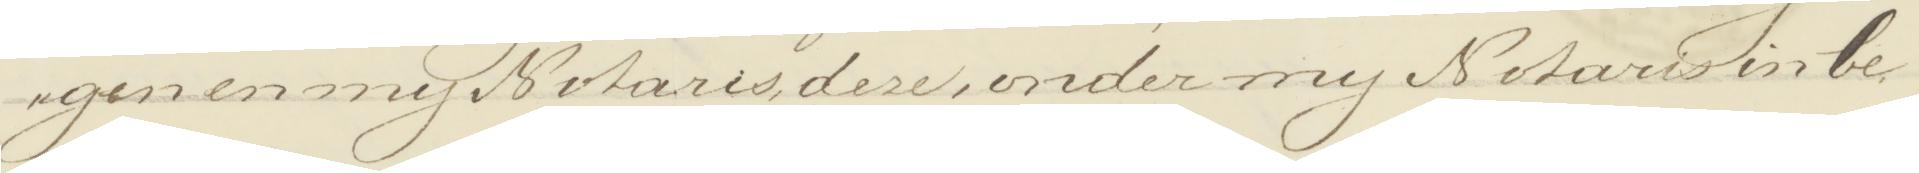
gen en my Notaris, deze, onder my Notaris in be
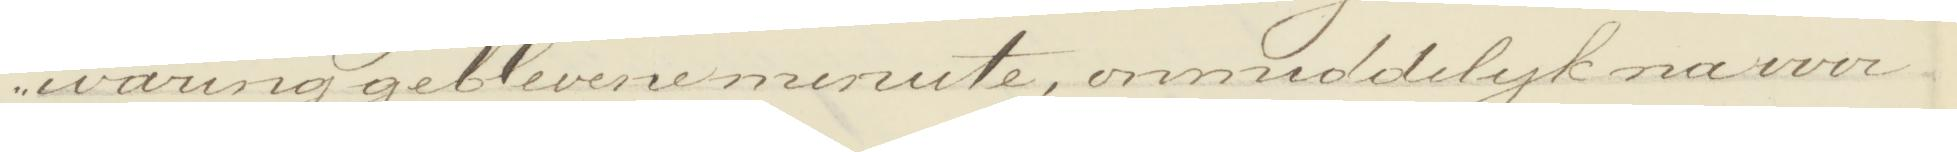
„waring geblevene minute, onmiddelyk na voor
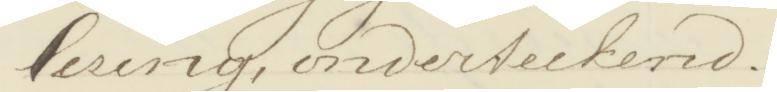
lezing, onderteekend.
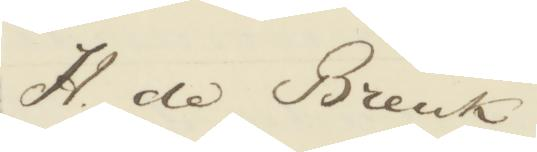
H. de Breuk
